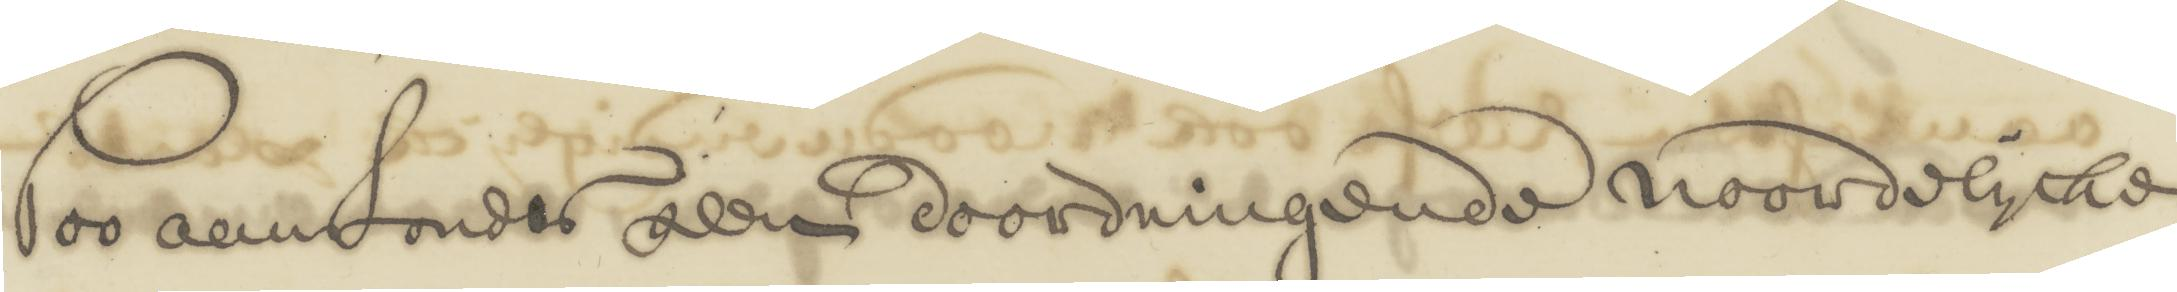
soo aanstondts een doordringende noordelijcke
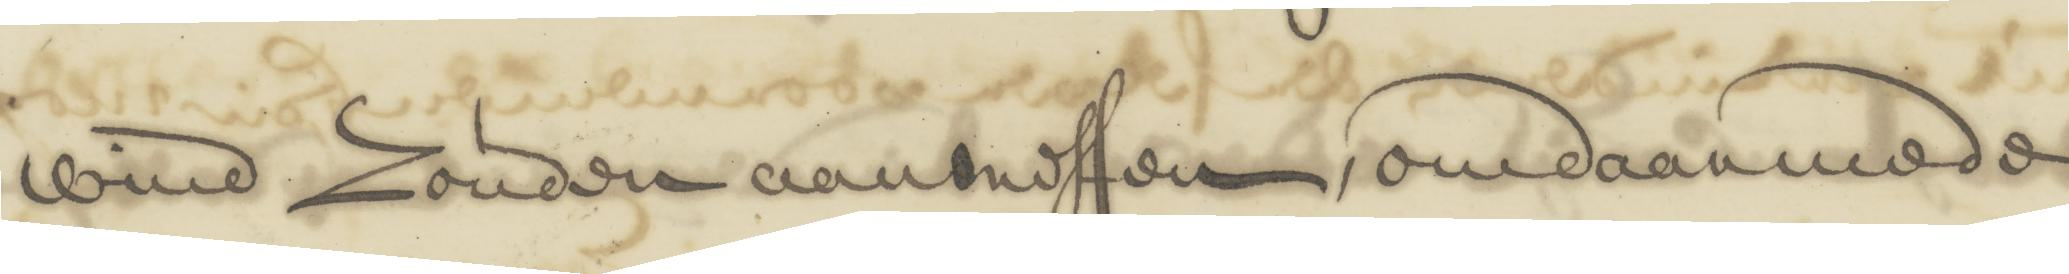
wind zouden aantreffen, om daarmede
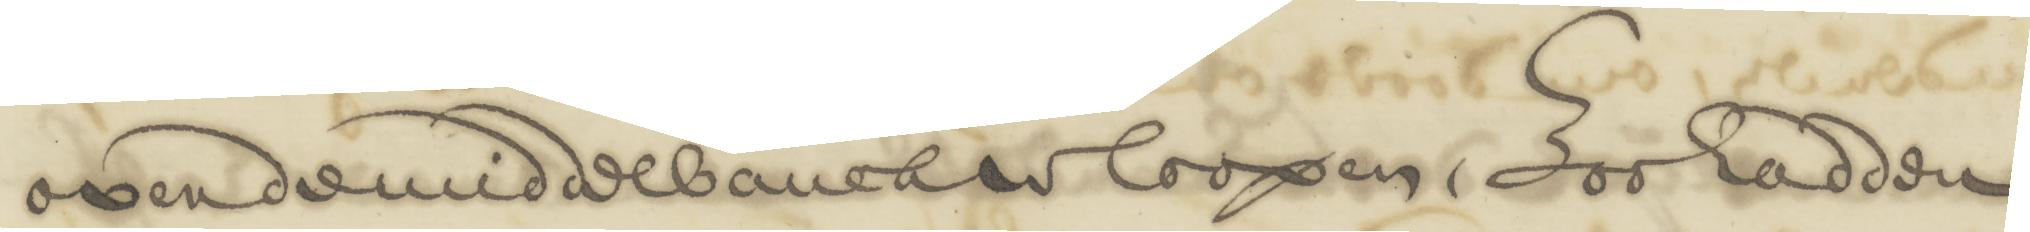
over de middelbanck te loopen, zoo hadden
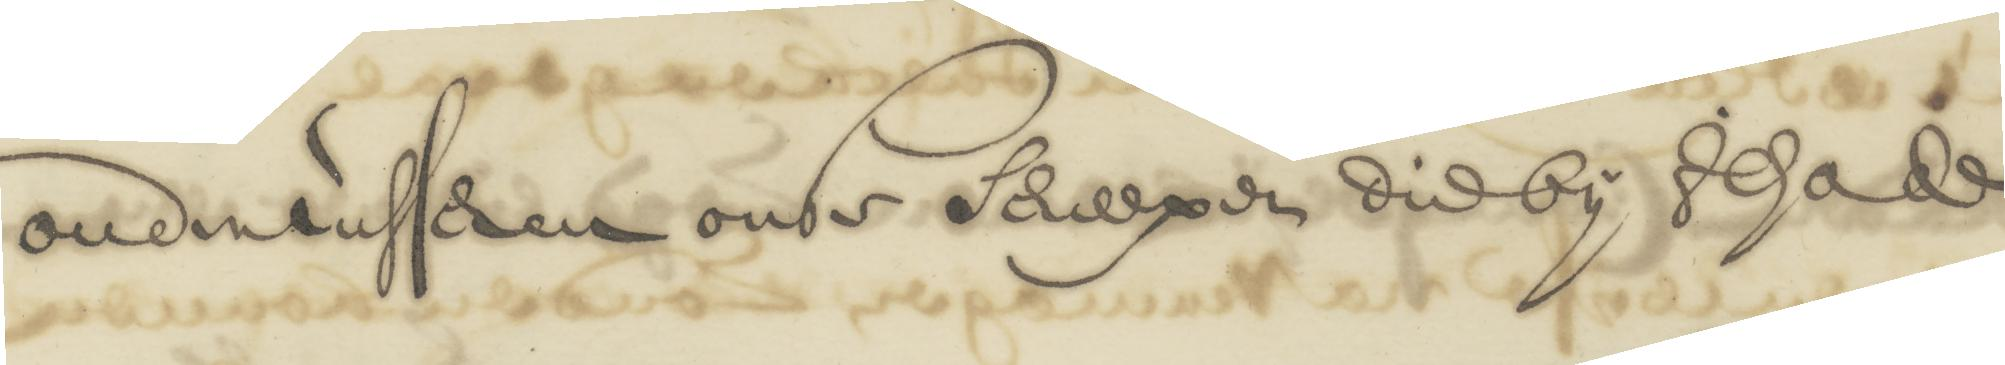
ondertusschen onse scheepen die bij jlha de
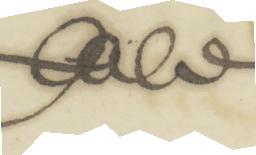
Gale
